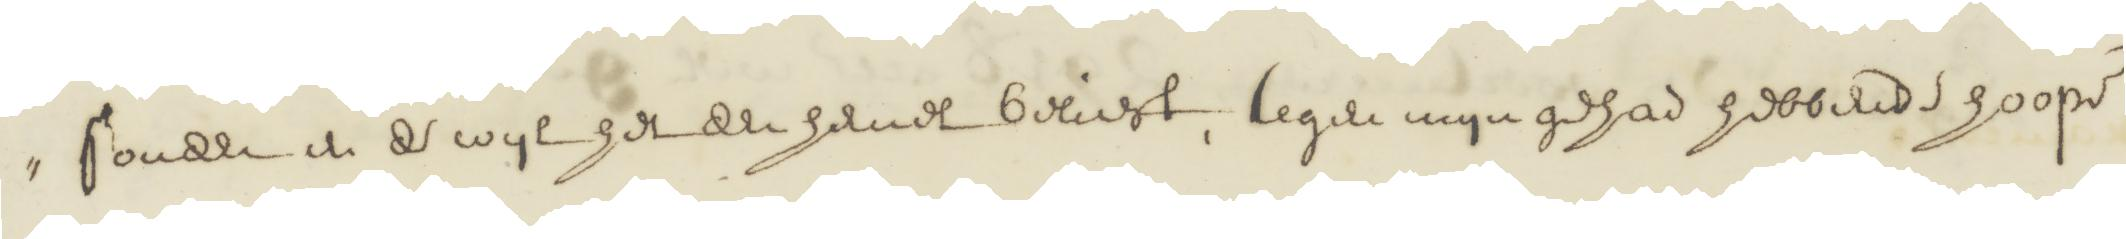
„ sonden en de wyl het den hemel belieft, tegen myn gehad hebbende hoope
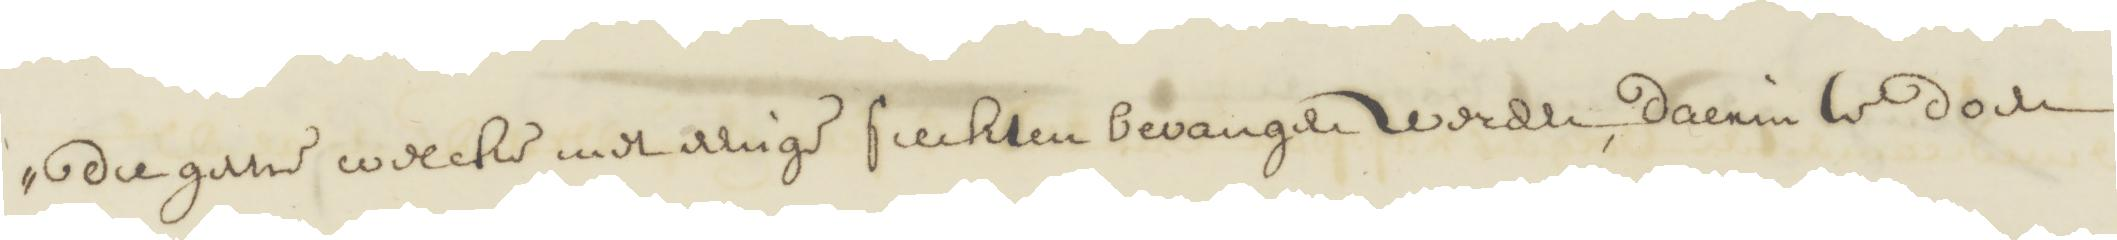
„ die geene welcke met eenige sieckten bevangen werden, daerin te doen
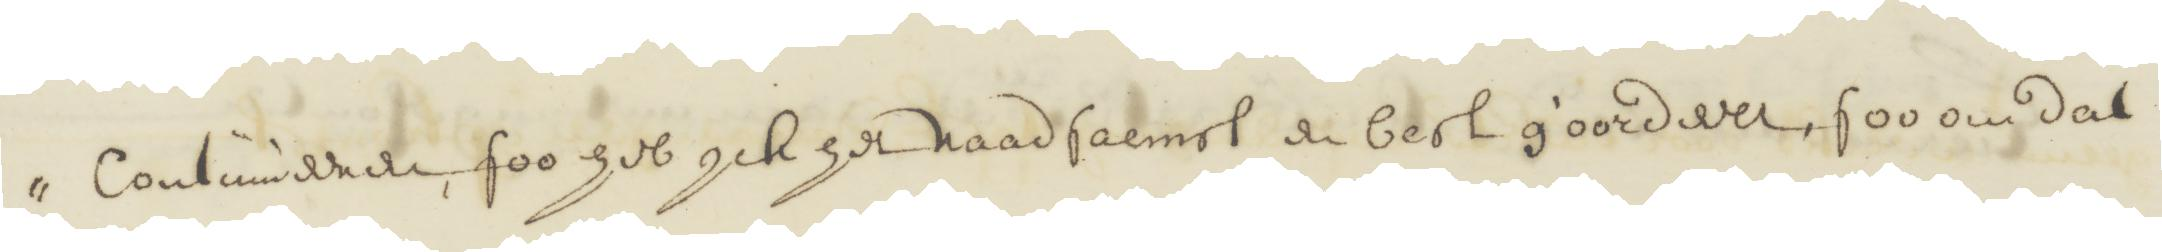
„ Continueeren, soo heb jck het raadsaemst en best g’oordeelt, soo om dat
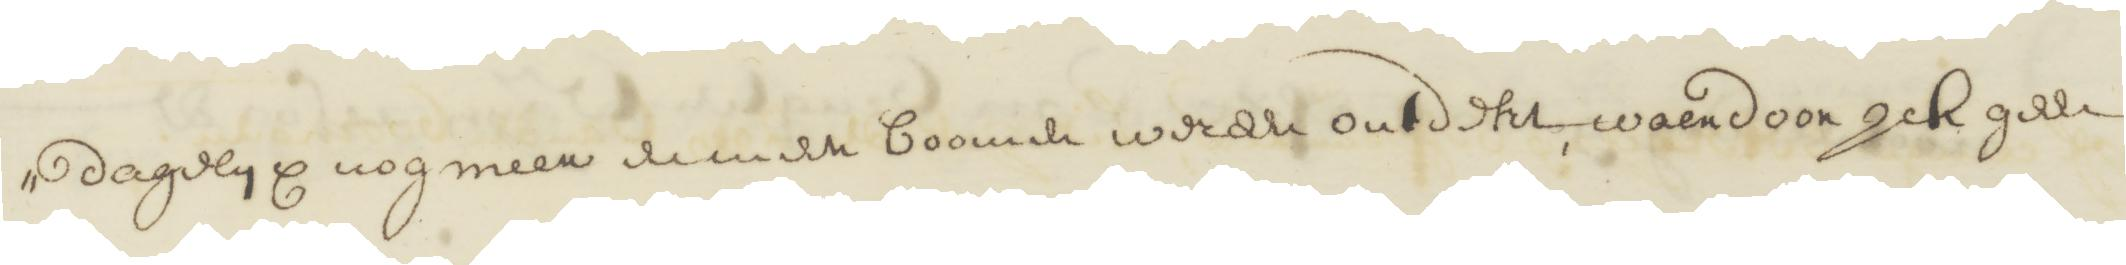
„ dagelyx nog meer en meer boomen werden ontdekt, waer door jck geen
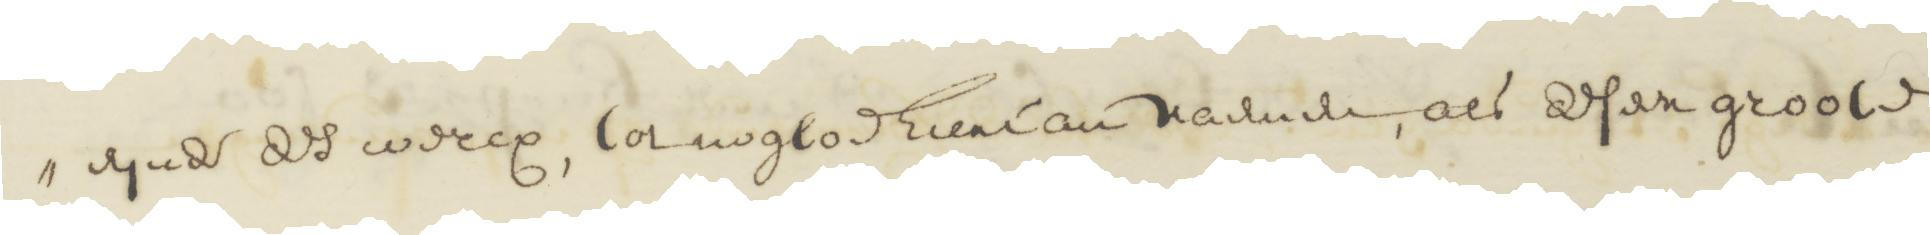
„ eynde des wercx, tot nogtoe hiervan raemen, als deser groote
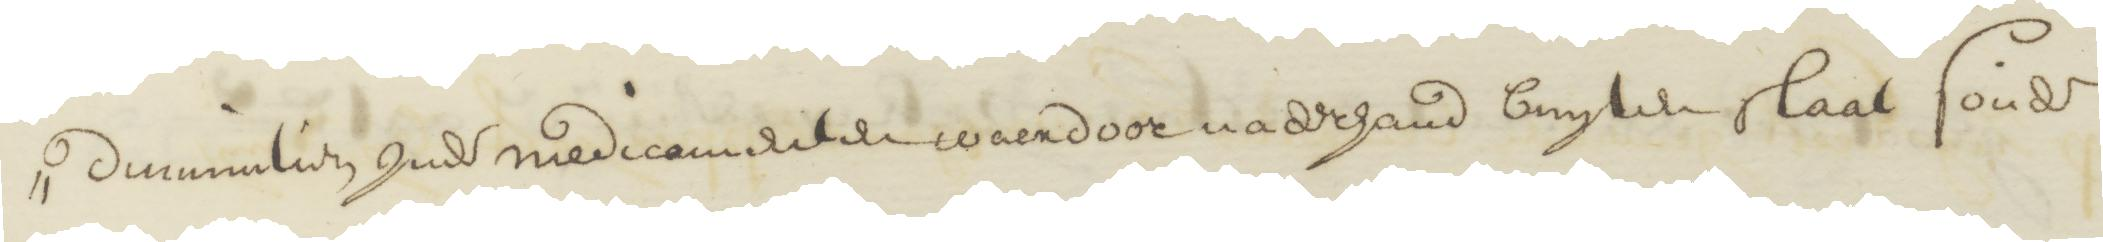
„ diminutien jnde medicamenten waer door naderhand buyten staat soude
